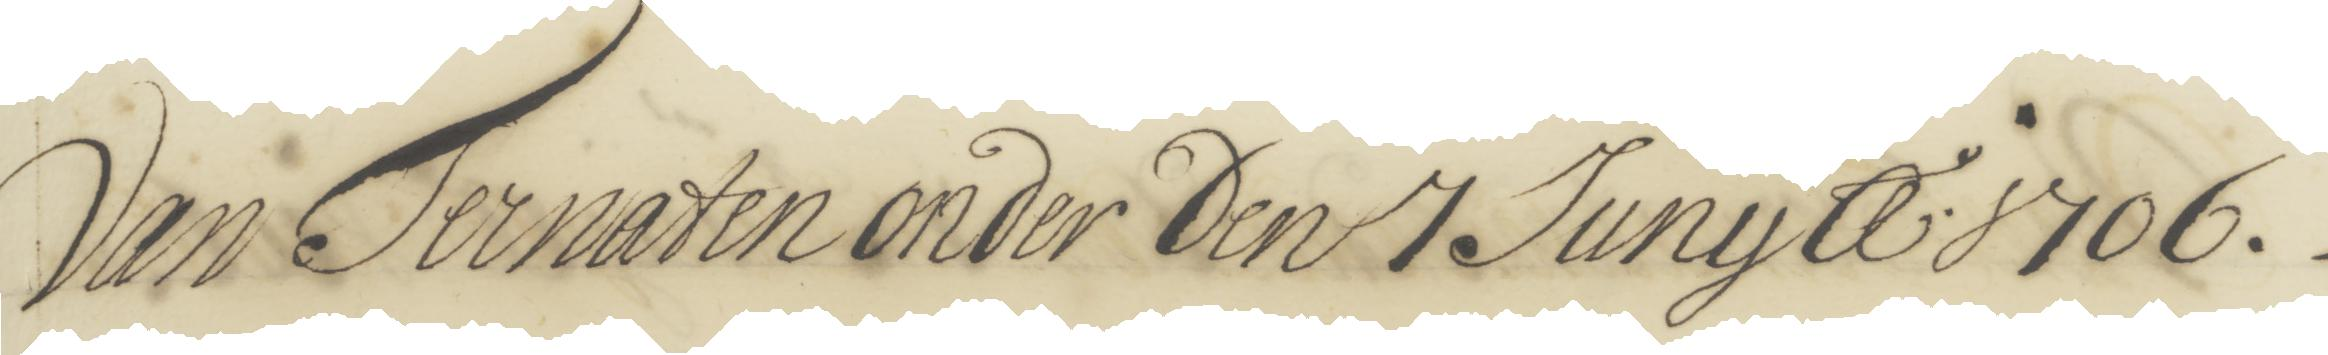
Van Ternaten onder den 7 Iunij A:o 1706.
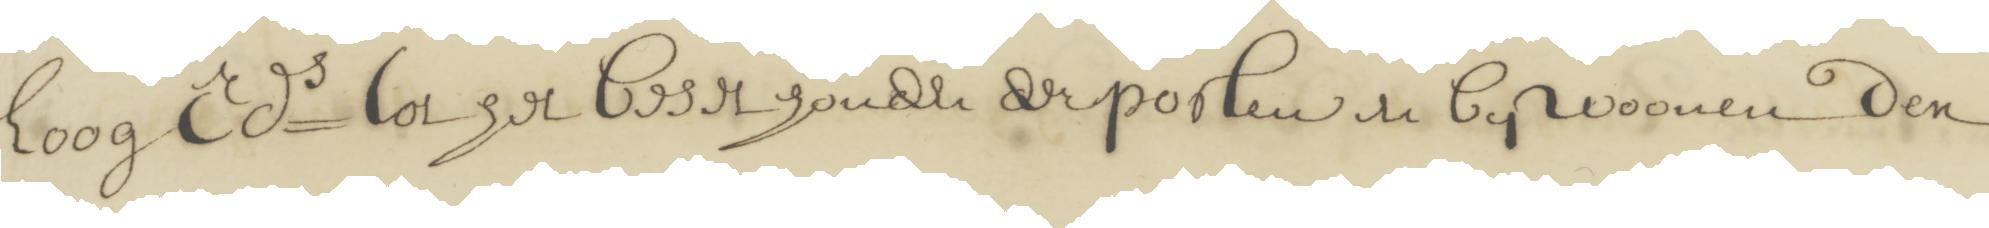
hoog Ed=s tot het beset houden der posten en bywoonen der
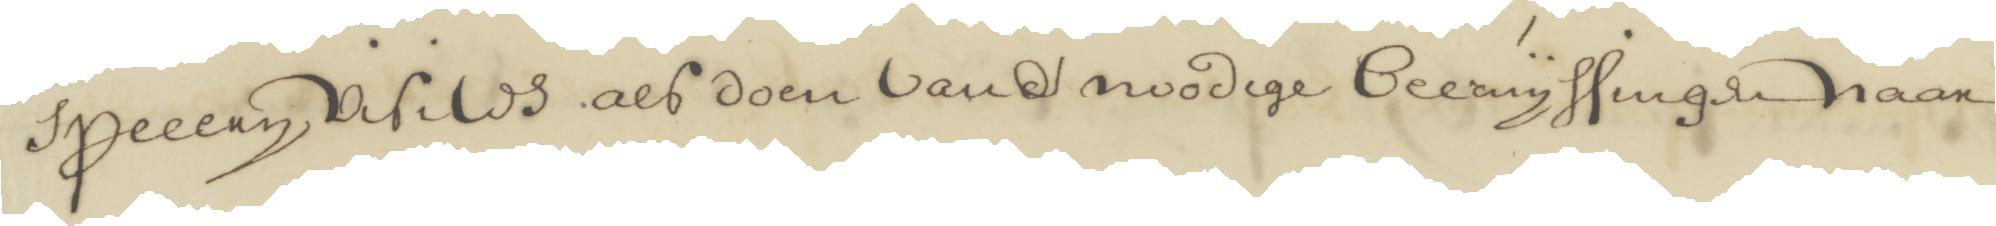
specery visites als doen van de noodige becruijssingen naar
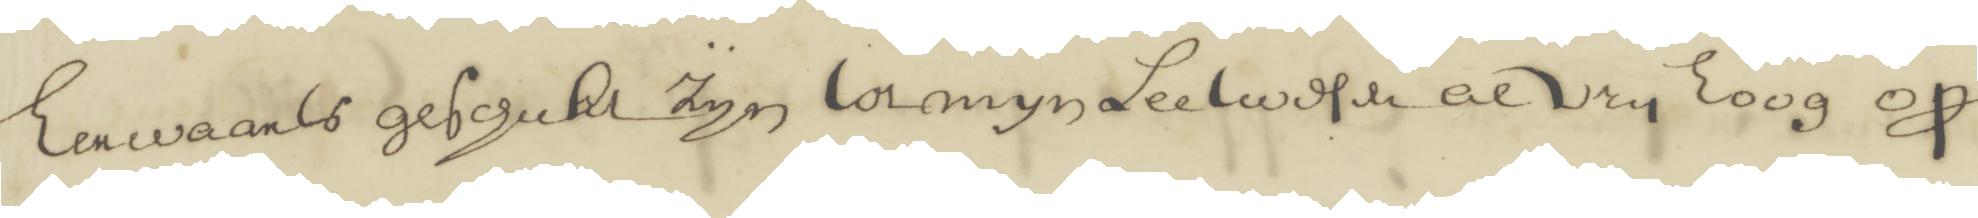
herwaarts geschickt zijn tot myn Leetwesen al vry hoog op
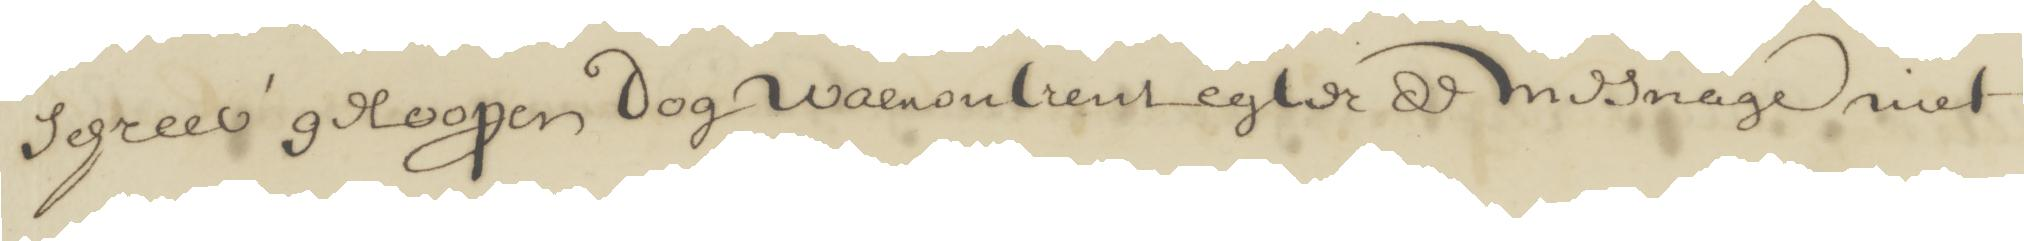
schreev' geloopen dog waer ontrent egter de meenage niet
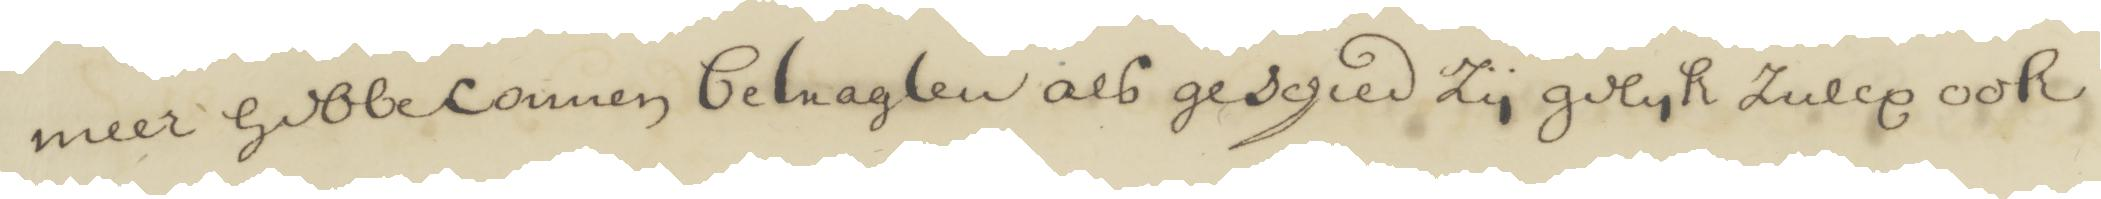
meer hebbe connen betragten als geschied zij gelyk zulcx ook
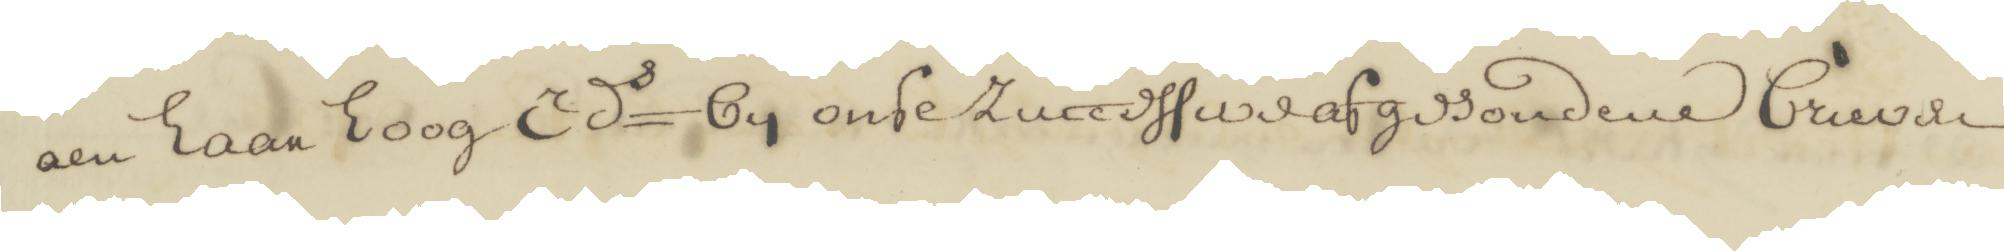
aen haar hoog Ed=s by onse zuccessive afgesondene brieven
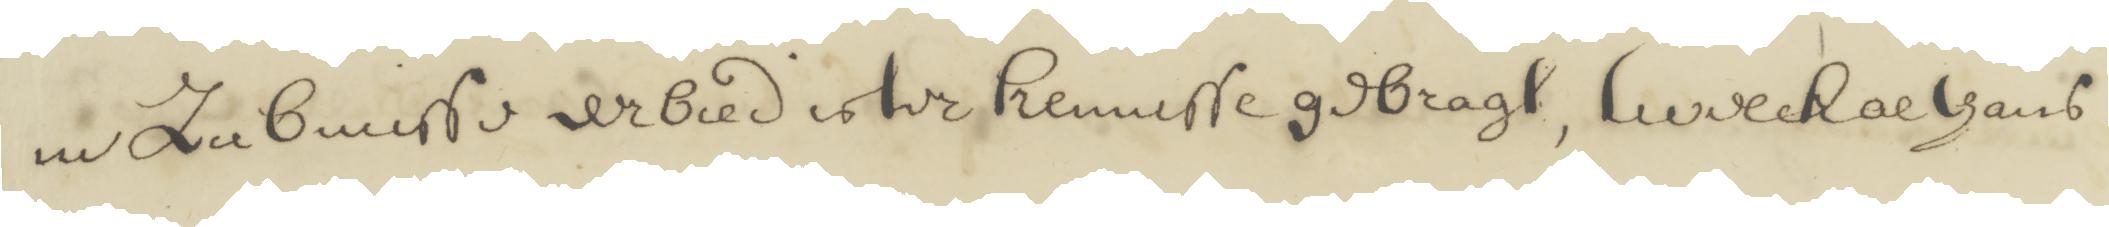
in Zubmisse eerbied is ter kennisse gebragt, twelck althans
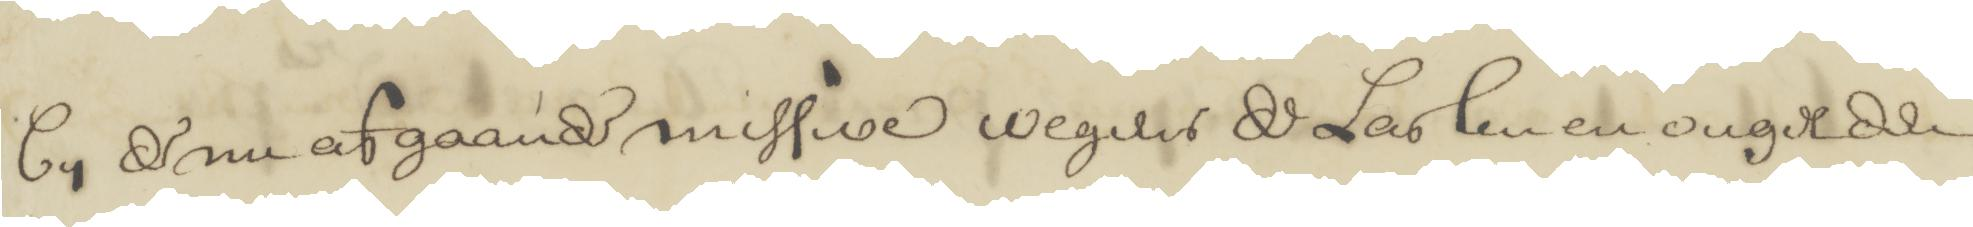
by de nu afgaande missive wegens de Lasten en ongelden
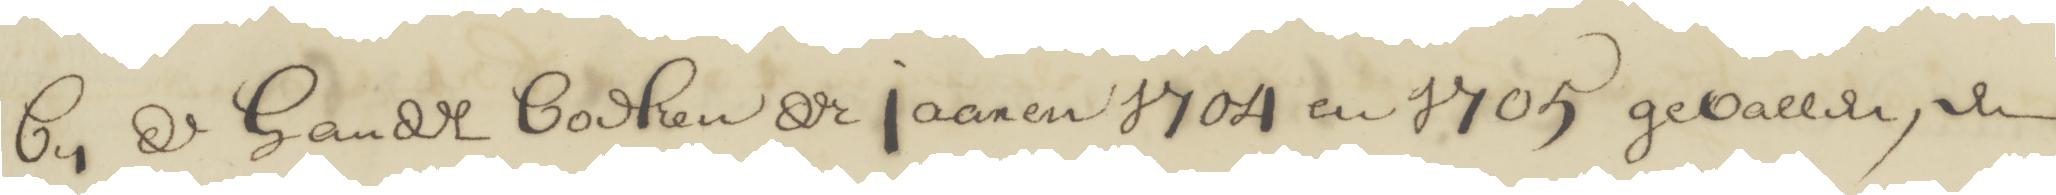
by de handel boeken der jaaren 1704 en 1705 gevallen, en
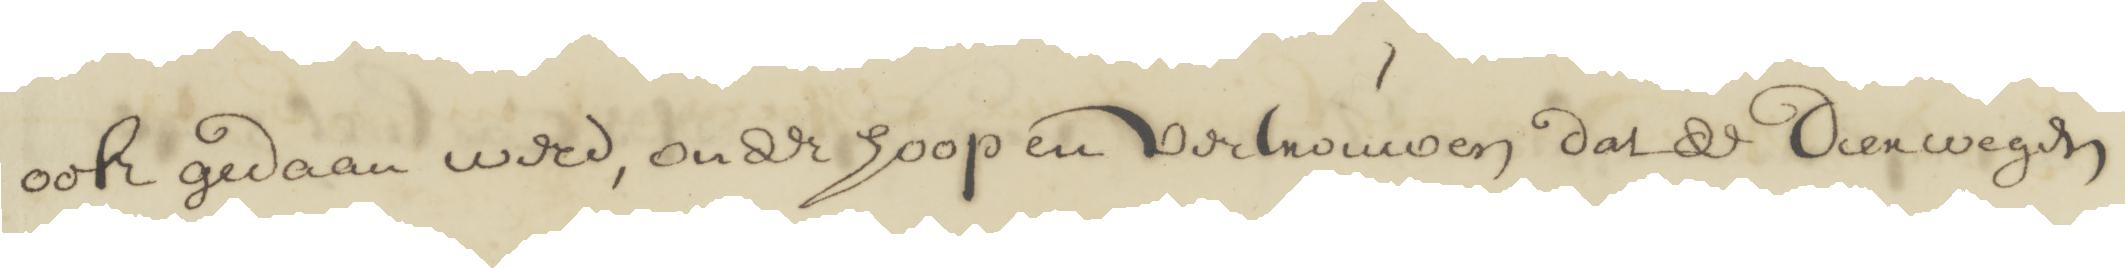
ook gedaan werd, onder hoop en vertrouwen dat de dier wegen
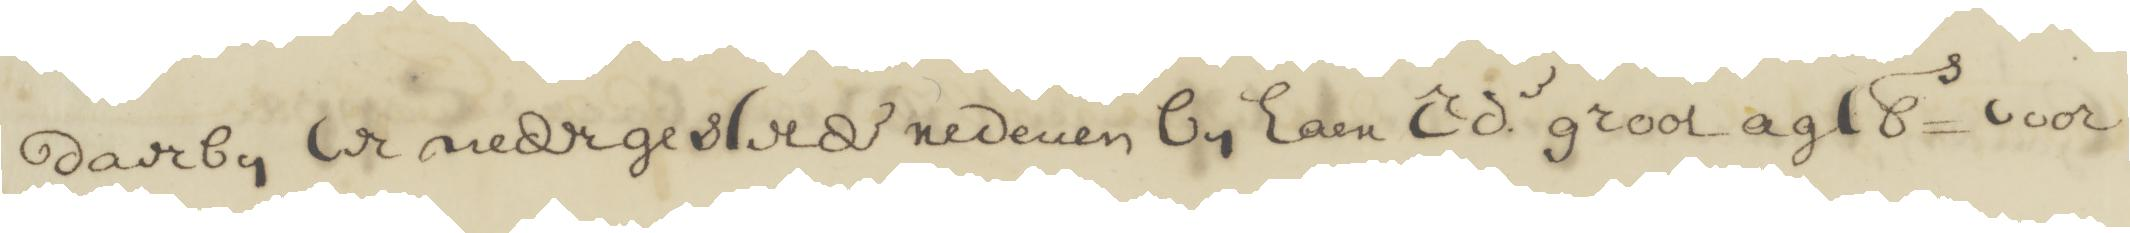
daerby ter neder gestelde redenen by haer Ed.e groot agtb=s voor
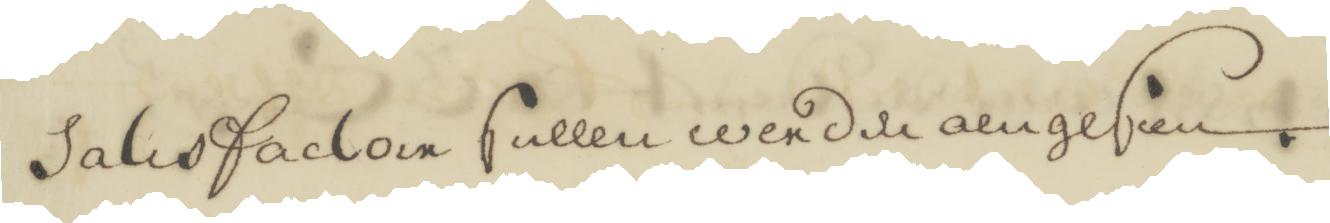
satisfactoir sullen werden aengesien.
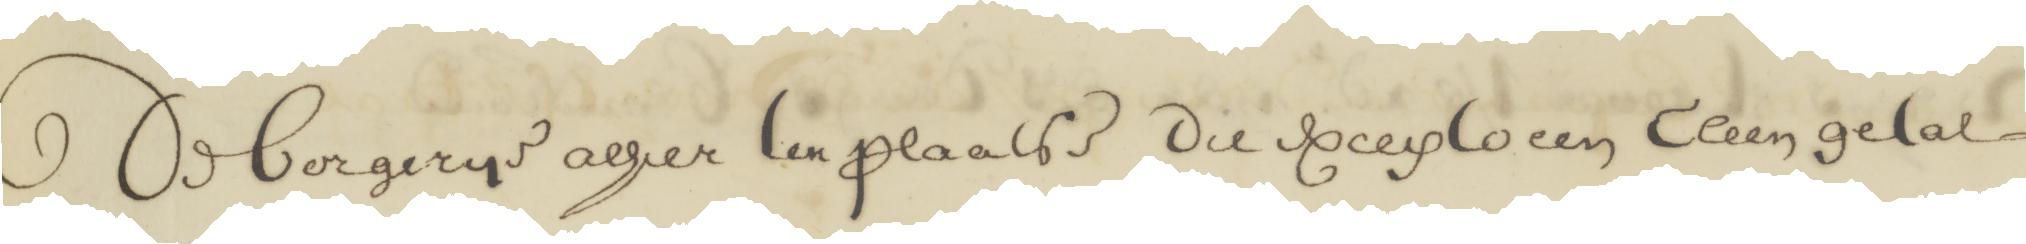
De borgerye alhier ter plaatse die excepto een Cleen getal
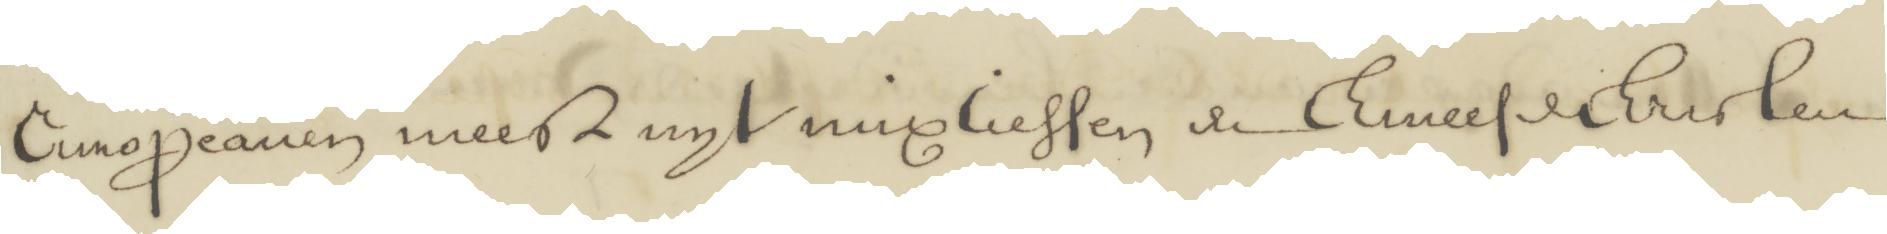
Europeanen meest uyt mixtiessen en Chineese christen
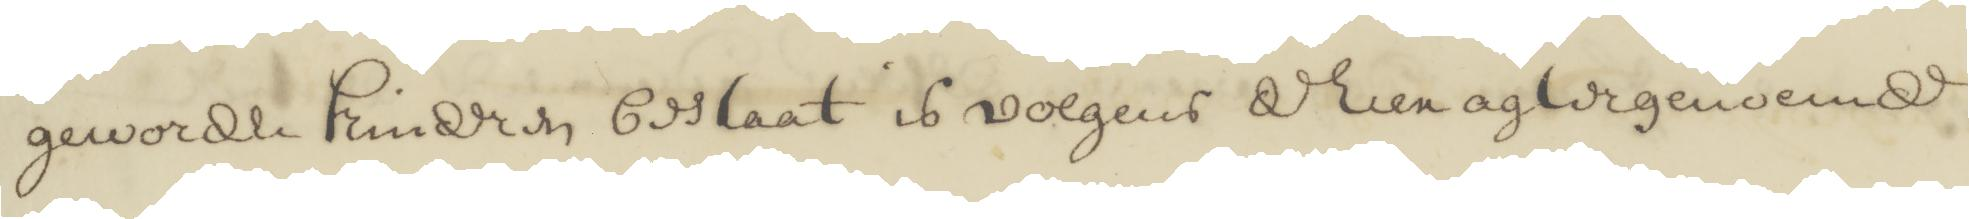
geworden kinderen bestaat is volgens de hier agtergenoemde
